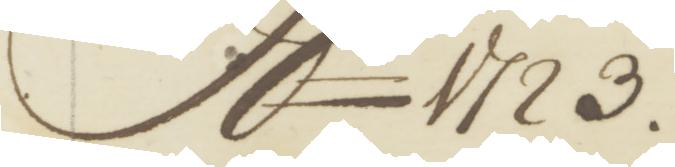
A=o 1723.
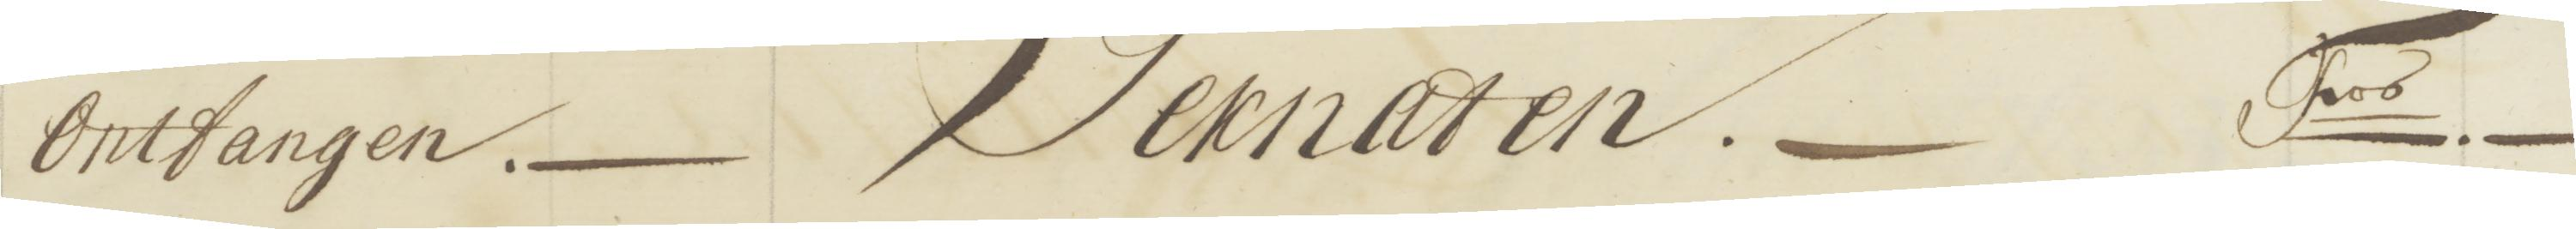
Ontfangen Ternaten. F=os
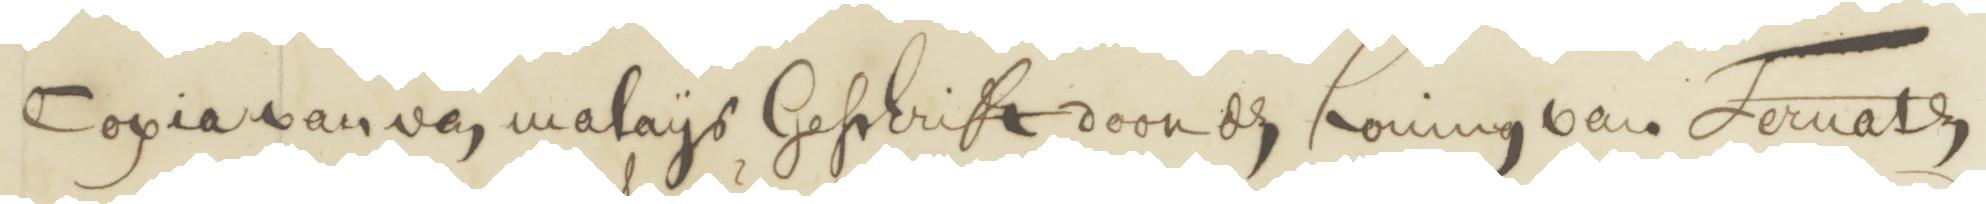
Copia van een malaijs Geschrift door den koning van Ternaten
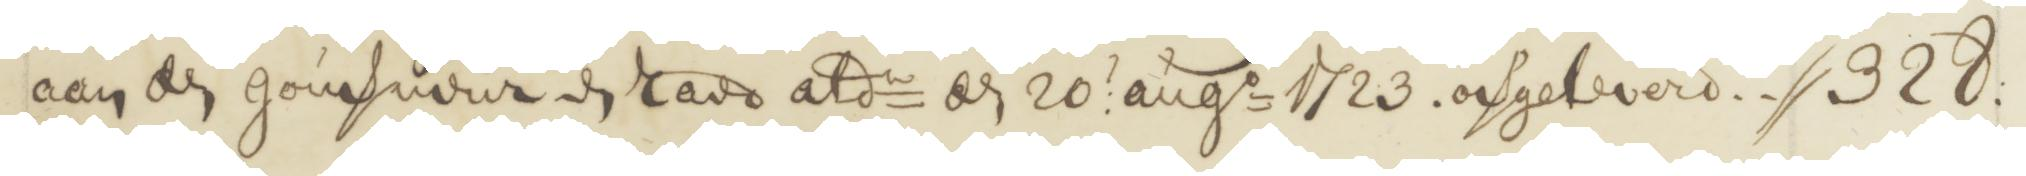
aan den gouverneur en Raed ald=r den 20:' aug=o 1723. overgeleverd. . „ 328:
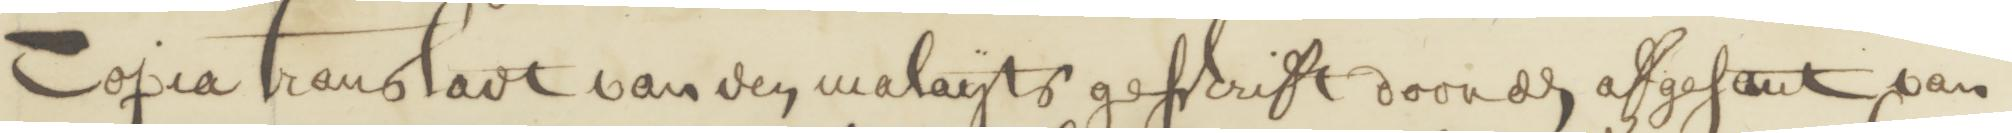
Copia translaet van een malaijts geschrift door den afgesant van
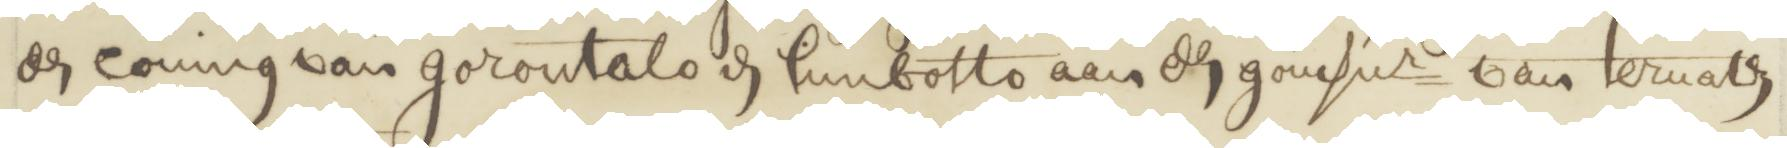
den Coning van gorontalo en limbotto aan den gouvern=r van ternaten
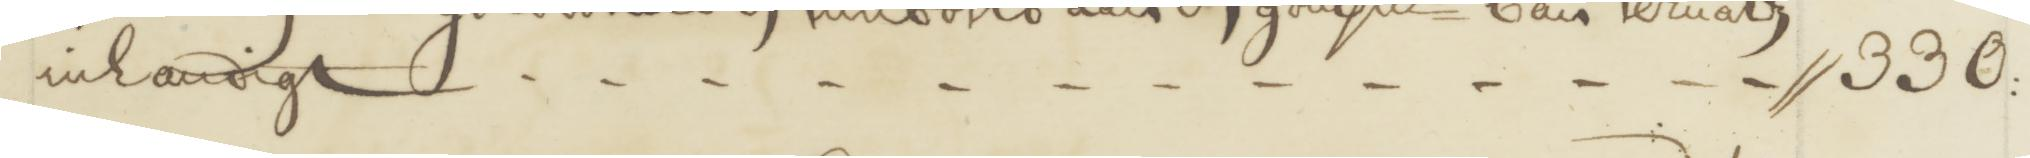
inhandigt - - - - - - - - - - - - - „ 330:
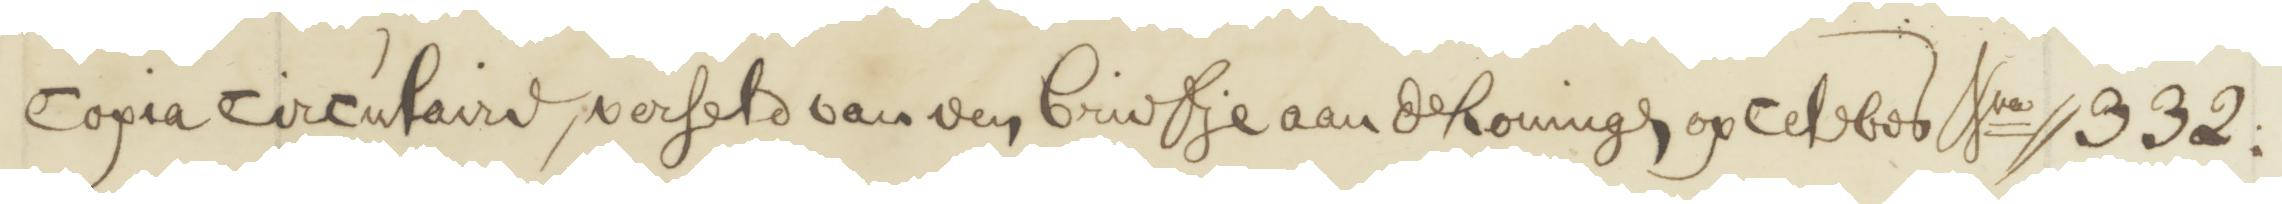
Copia Circulaire, verseld van een briefje aan de koningen op Celebes &=ra „ 332:
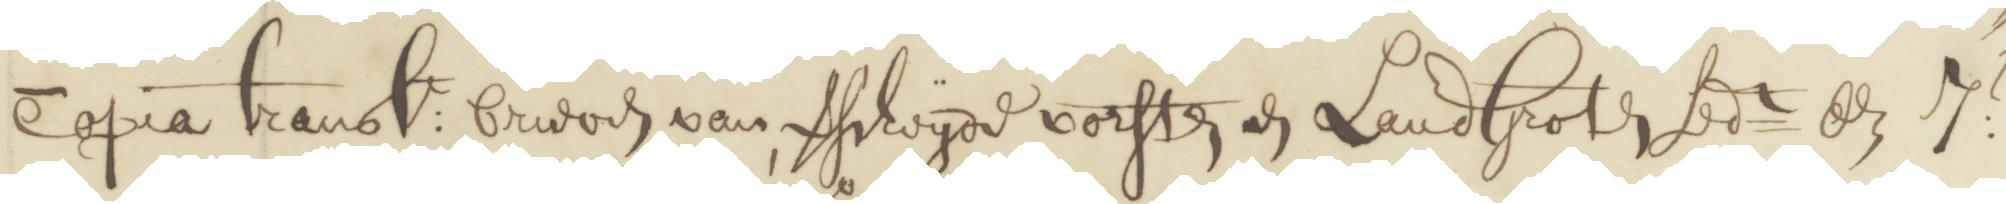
Copia transl:t brieven van verscheijde vorsten en Land Groten Sed=t den 7:'
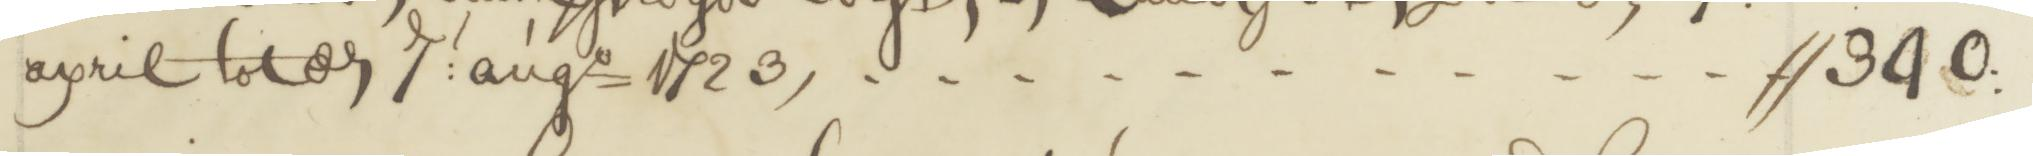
april tot den 7:' aug=o 172 - - - - - - - - - - - - „ 340:
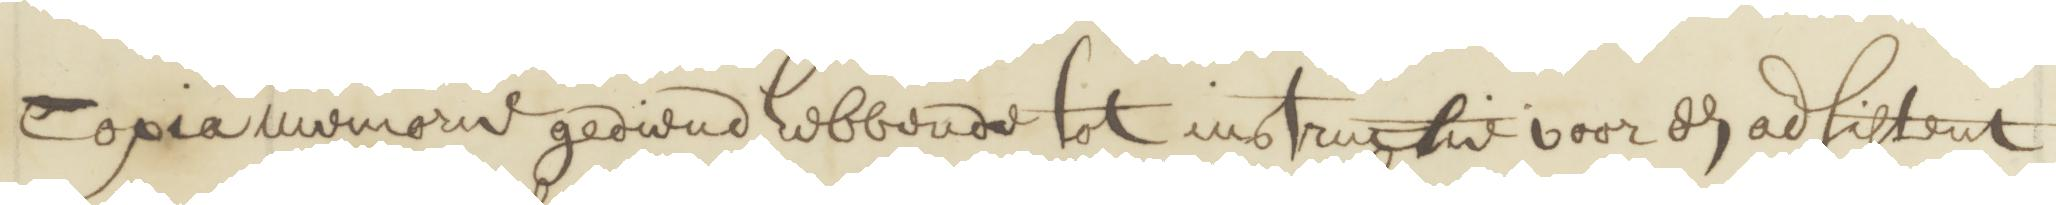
Copia memorie gediend hebbende tot instructie voor den adsistent
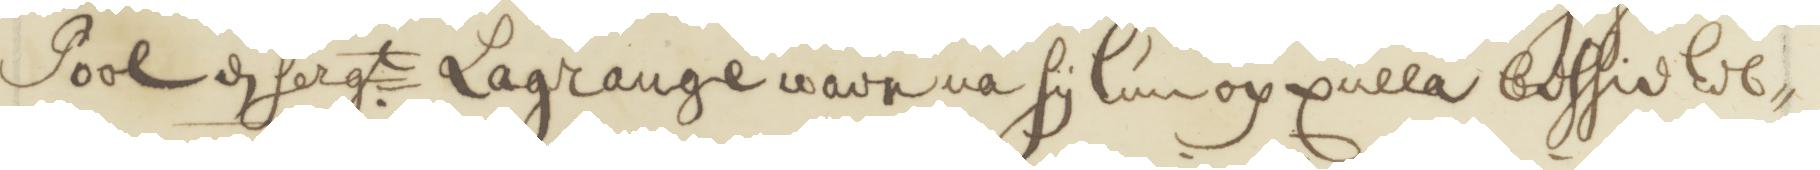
Pool en serg=t Lagrange waer na Sij hun op xulla bessie heb„
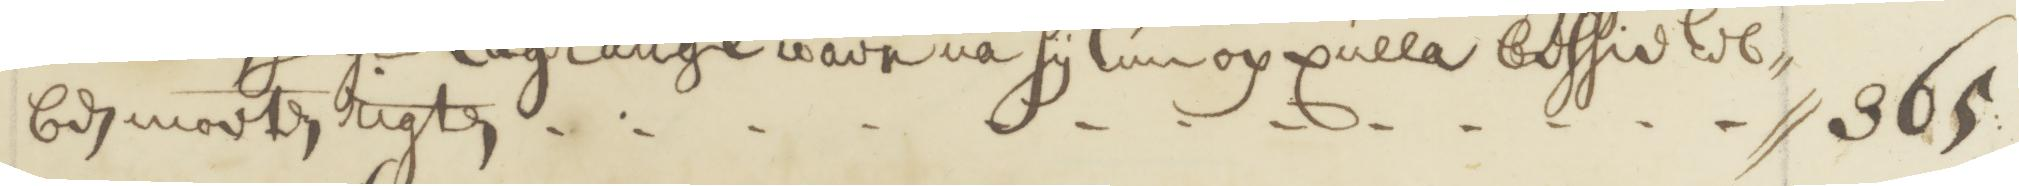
ben moeten rigten - - - - - - - - - - - - - -„ 365:
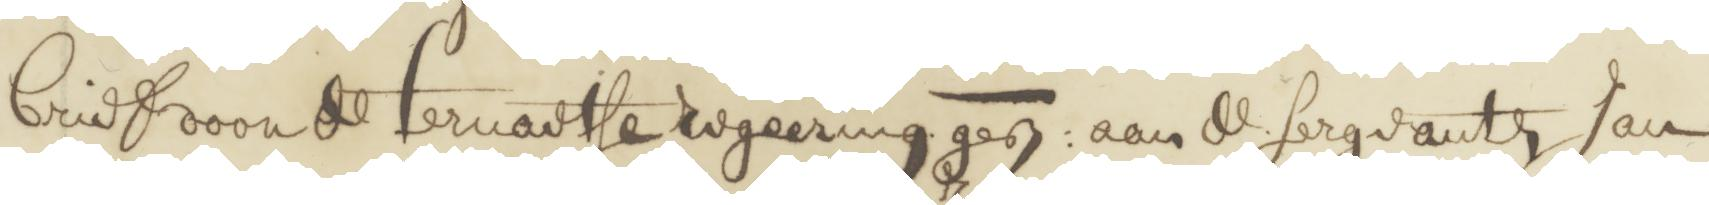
brief door de Ternaetse regeering gesz: aan de Sergeanten Jan
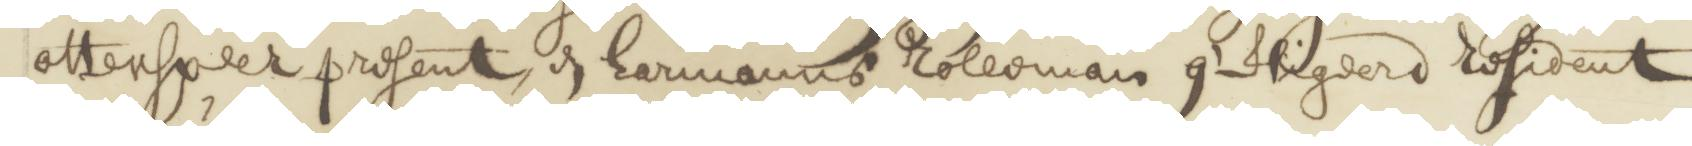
otterspeer present, en harmanus roleman g’Eliegeerd resident
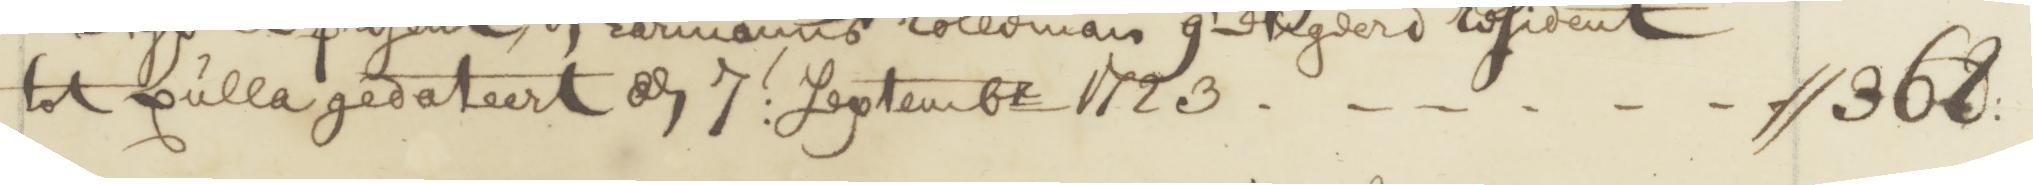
tot xulla gedateert den 7:' Septemb=r 1723- - - - - - - „ 368:
